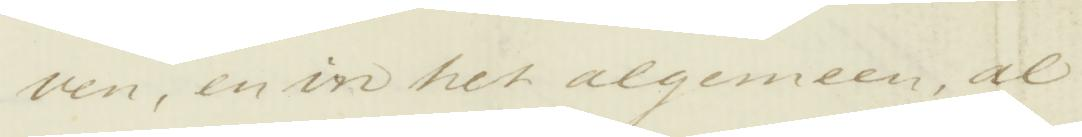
ven, en in het algemeen, al
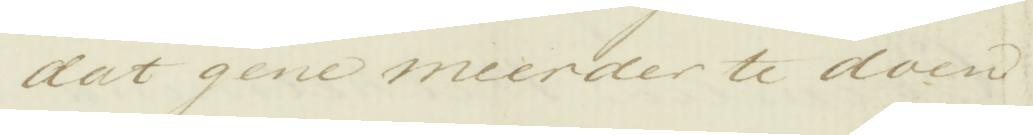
dat gene meerder te doen
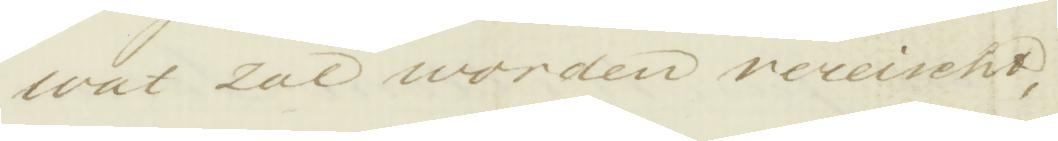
wat zal worden vereischt,
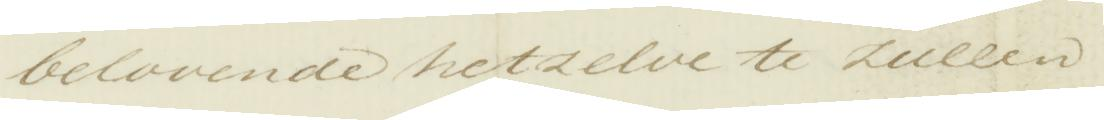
belovende hetzelve te zullen
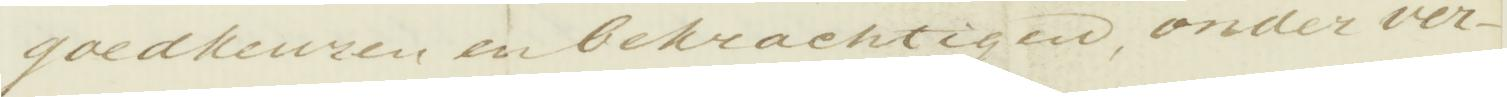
goedkeuren en bekrachtigen, onder ver-
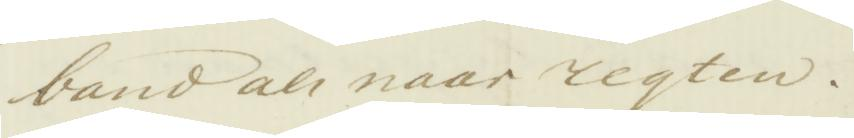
band als naar regten.
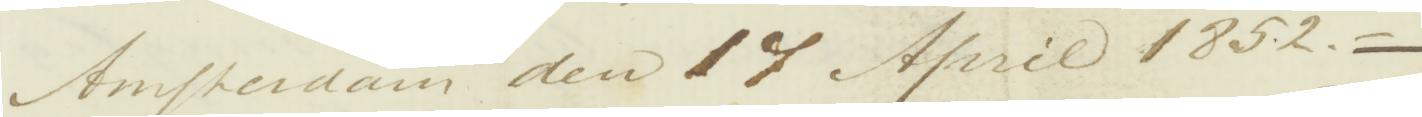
Amsterdam den 17 April 1852. —
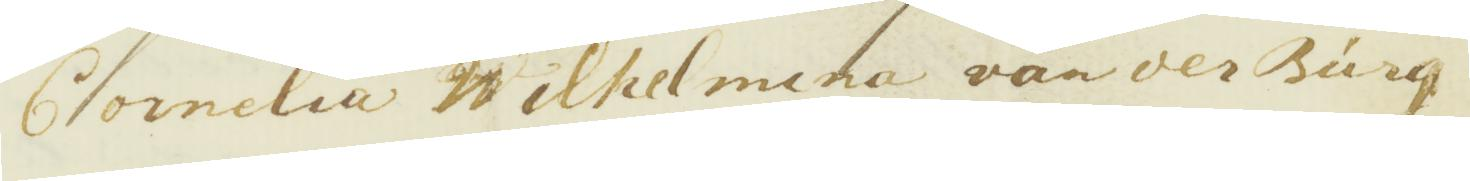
Cornelia Wilhemina van der Burg
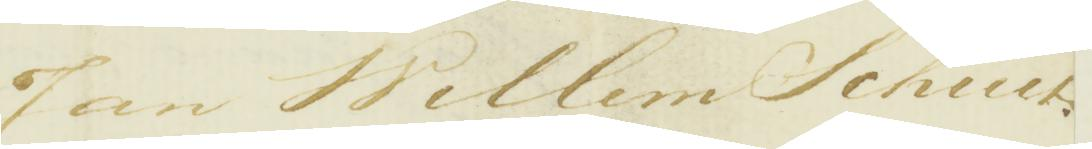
Jan Willem Schuit.
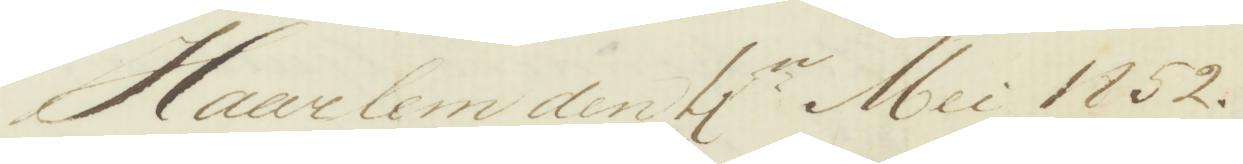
Haarlem den 4:n Mei 1852.
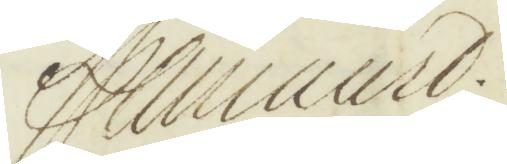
Pamaard.
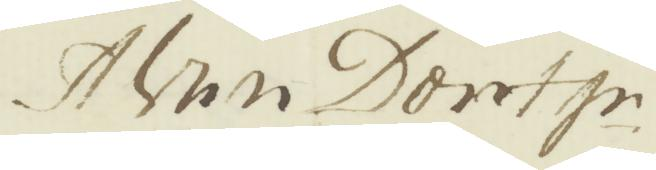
A Van Dort j-r.
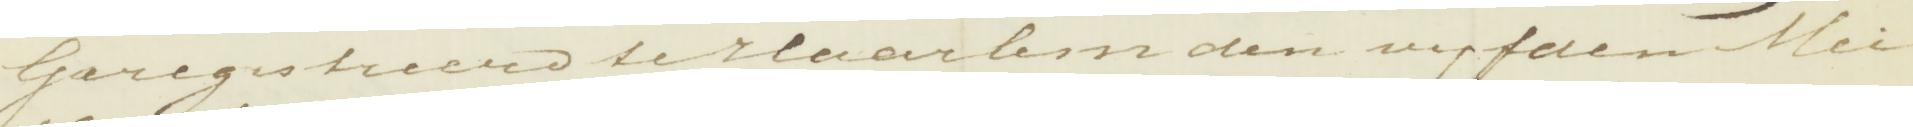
Geregistreerd teHaarlem den vyfden Mei
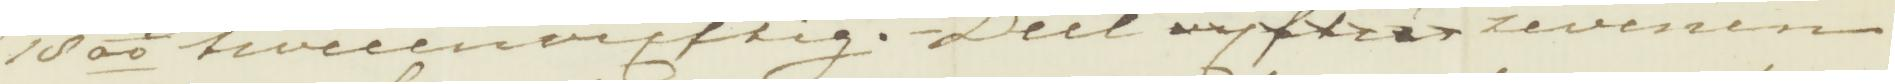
1800 tweeenvyftig. -Deel vyftien zevenen
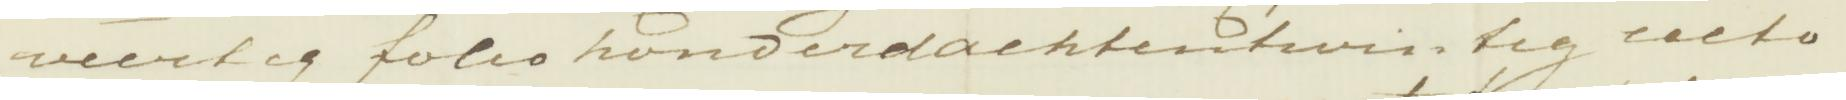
veertig folio honderdachtentwintig recto
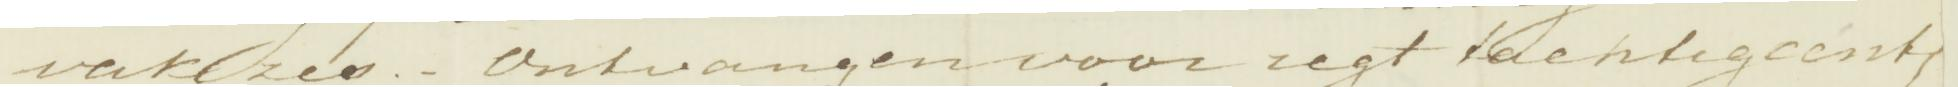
vak zes.- Ontvangen voor regt tachtig cents
